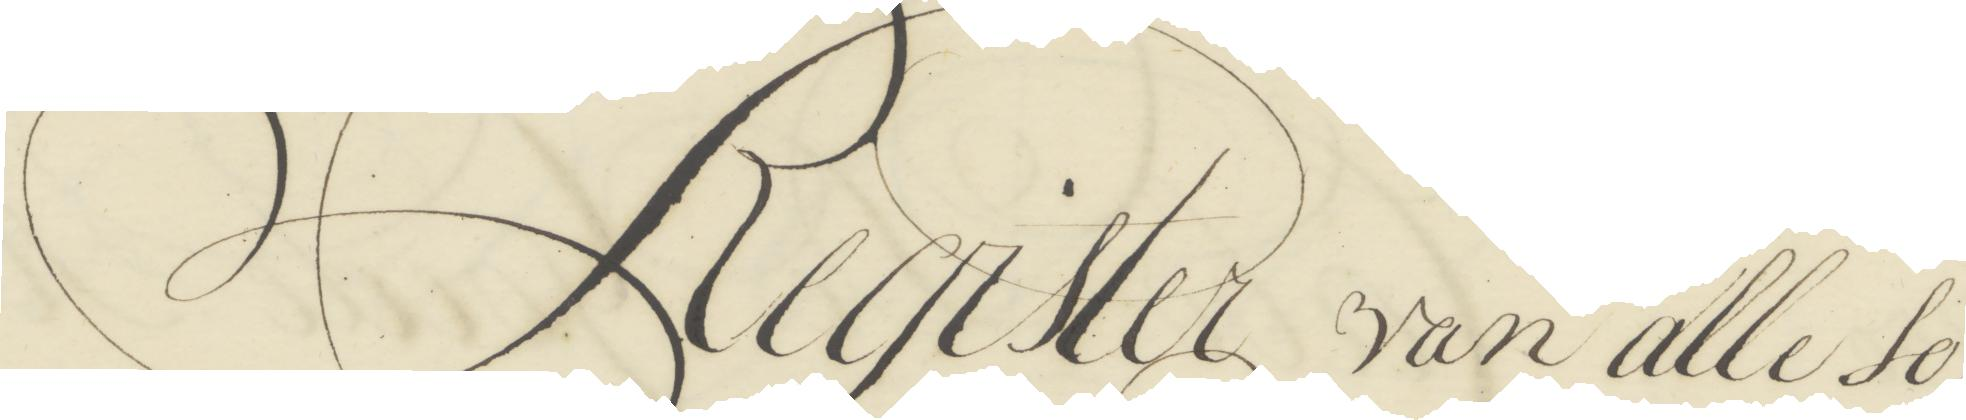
Register van alle so
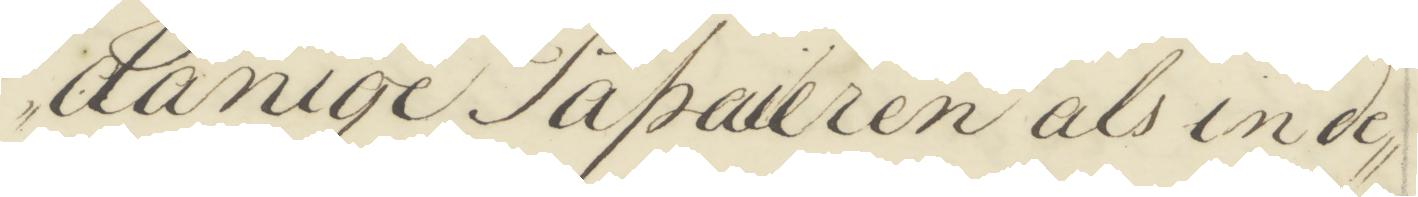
„danige Papaieren als in de„
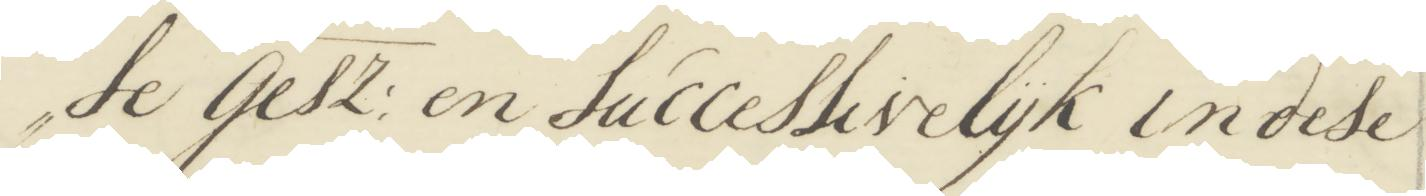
„se gesz: en successivelijk in dese
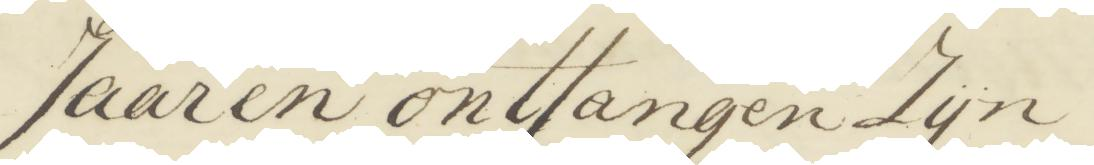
Jaaren ontfangen zijn
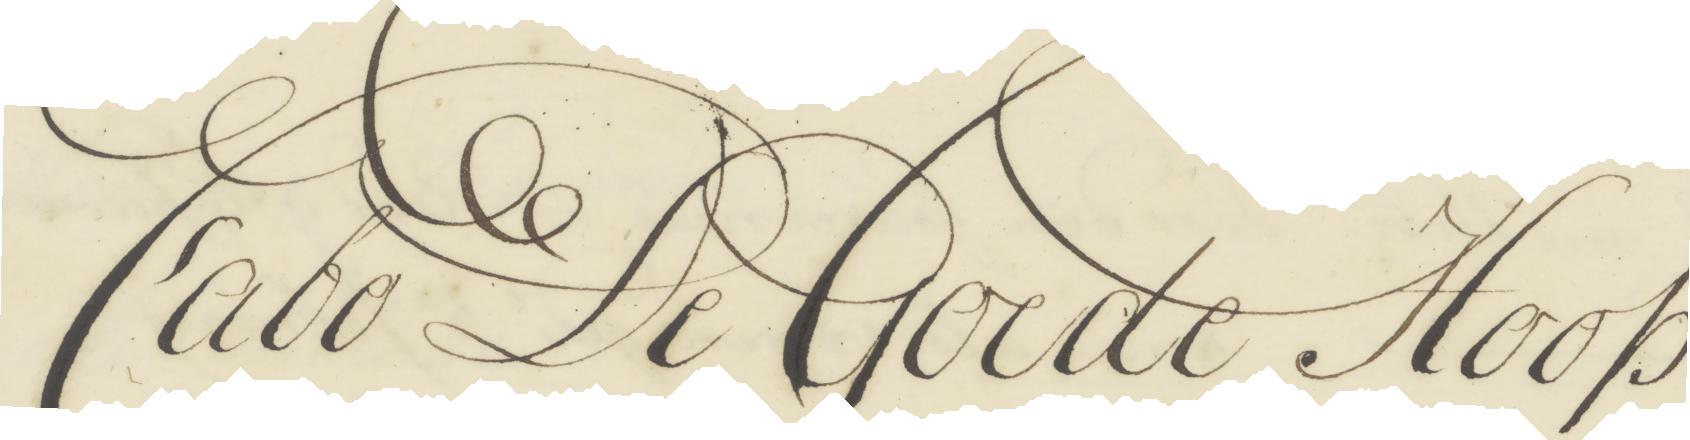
Cabo De Goede Hoop
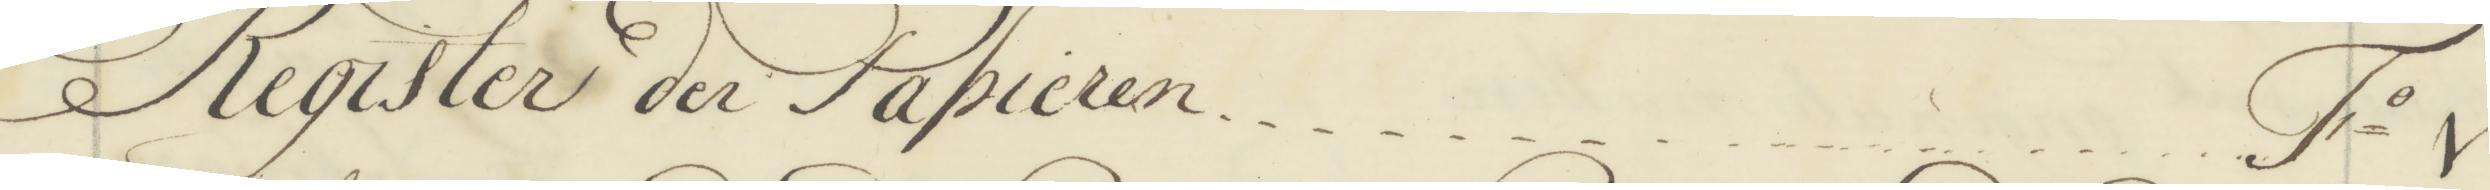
Register der Papieren - - - - - - - - - - - - - . . - . . . - . . . . . .F=o 1
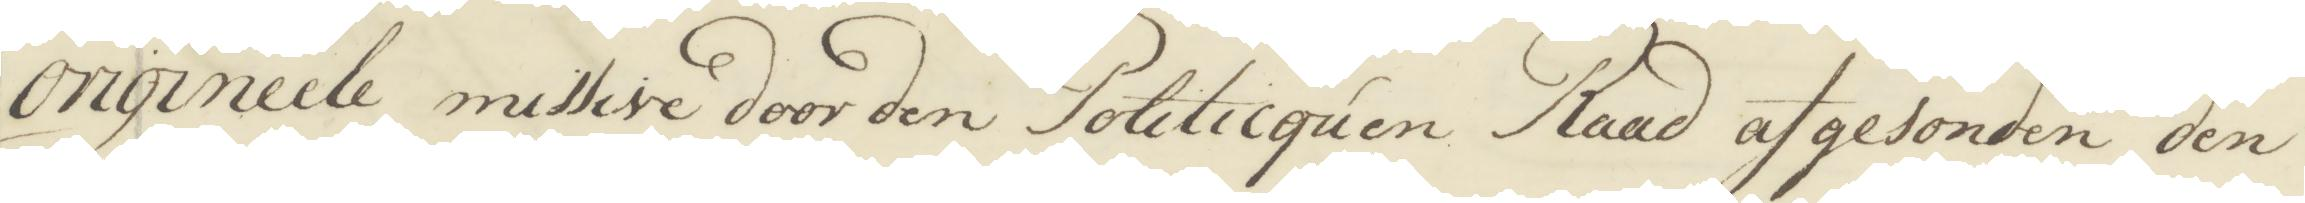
origineele missive door den Politicquen Raad afgesonden den
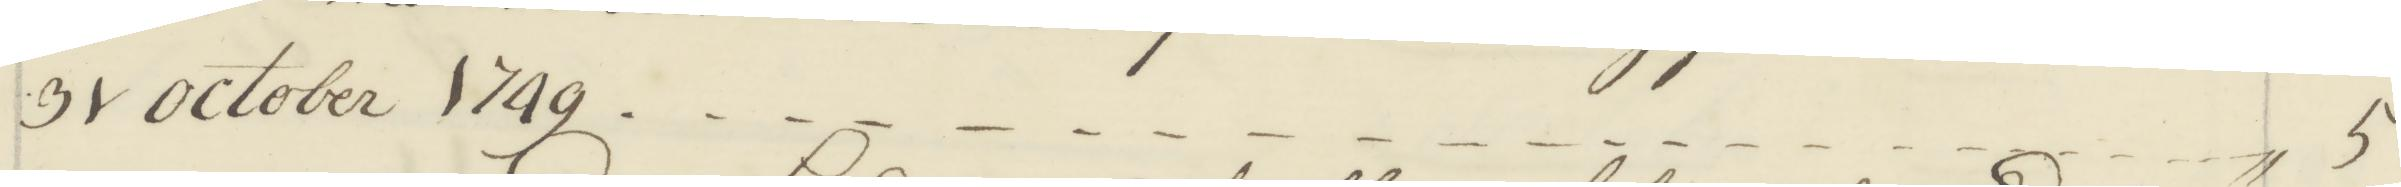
31 october 1749 . – – – — – – — — — — — – – – – – – – – – – – –„ 5
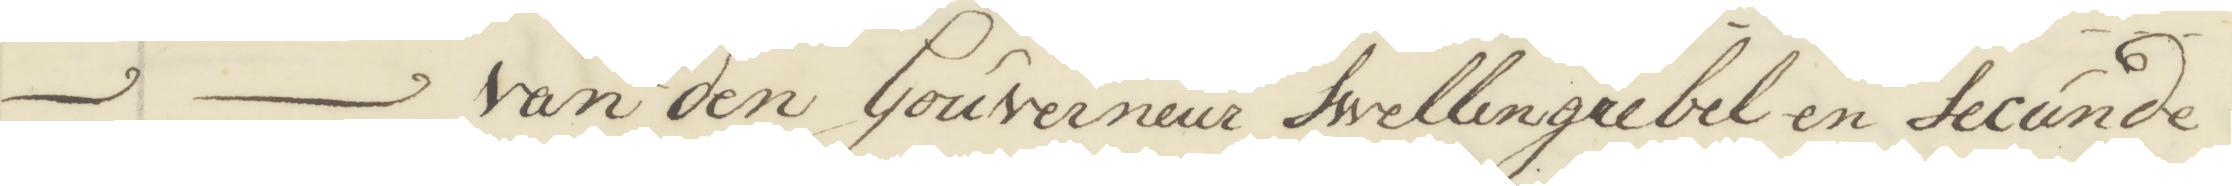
_o _o van den Gouverneur swellengrebel en secunde
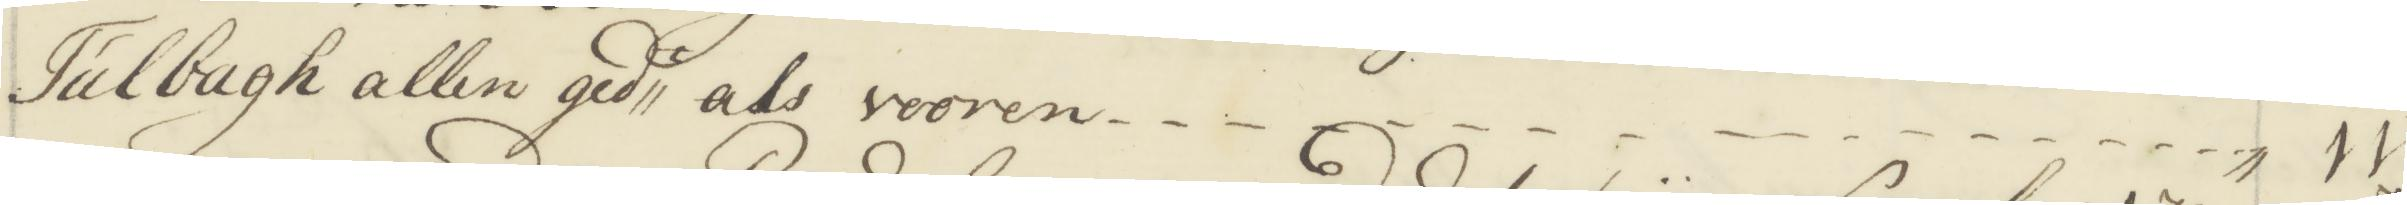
Tulbagh allen ged„t als vooren – – – – – – – – – – – – – – – – – – - -„ 11
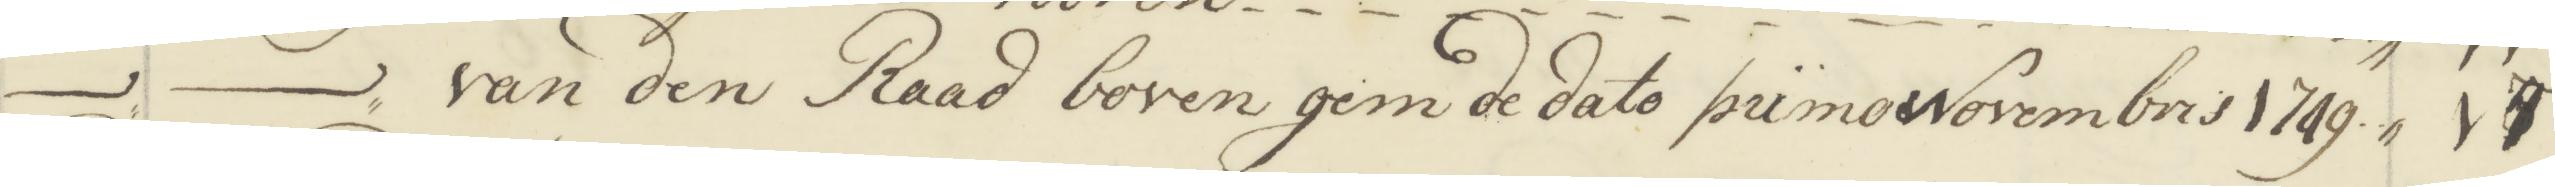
_„o _„o van den Raad boven gem de dato primo Novembris 1749. .„ 14
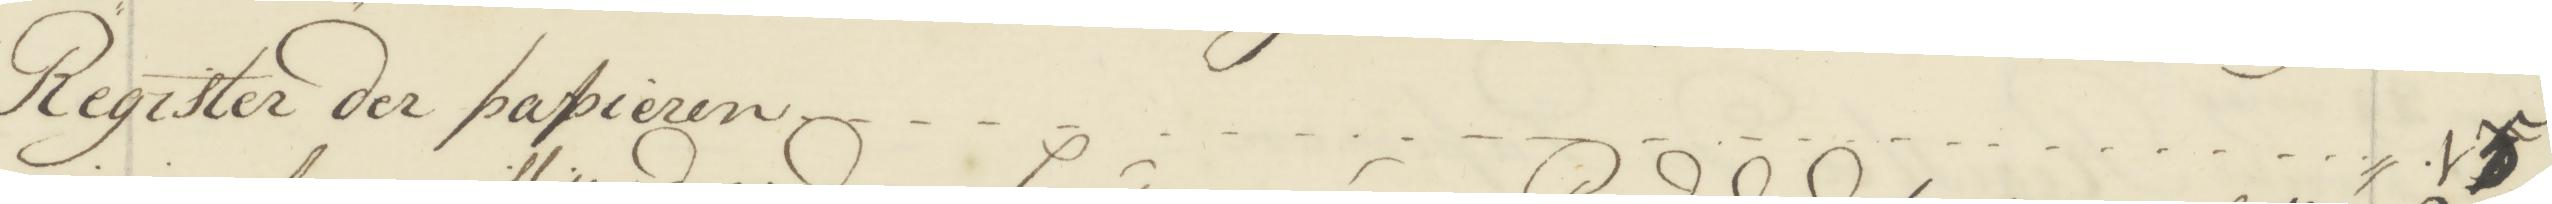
Register der papieren – – – – – . - - . - – – – . – - - - - - - - - - - - .„ . 15
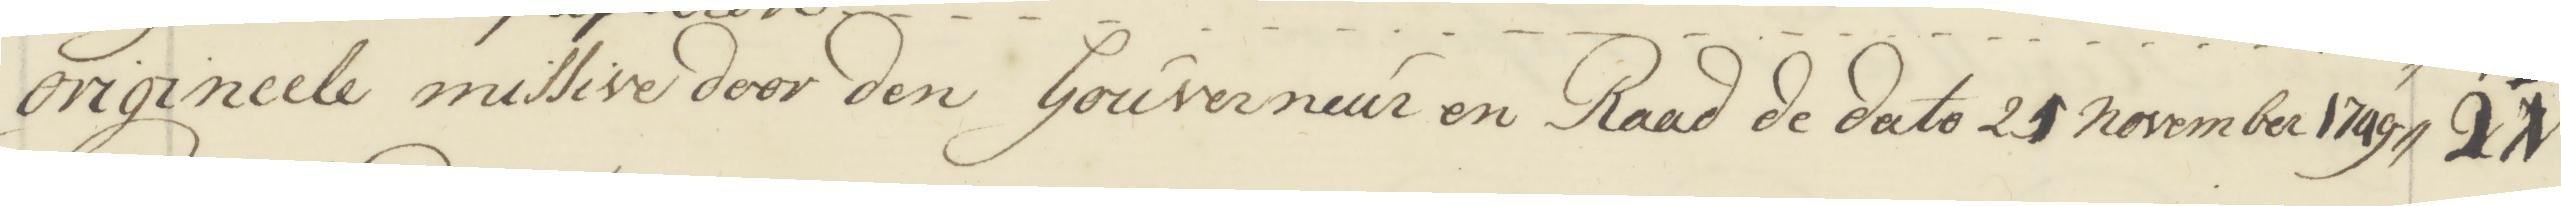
origineele missive door den Gouverneur en Raad de dato 25 november 1749.„ 21
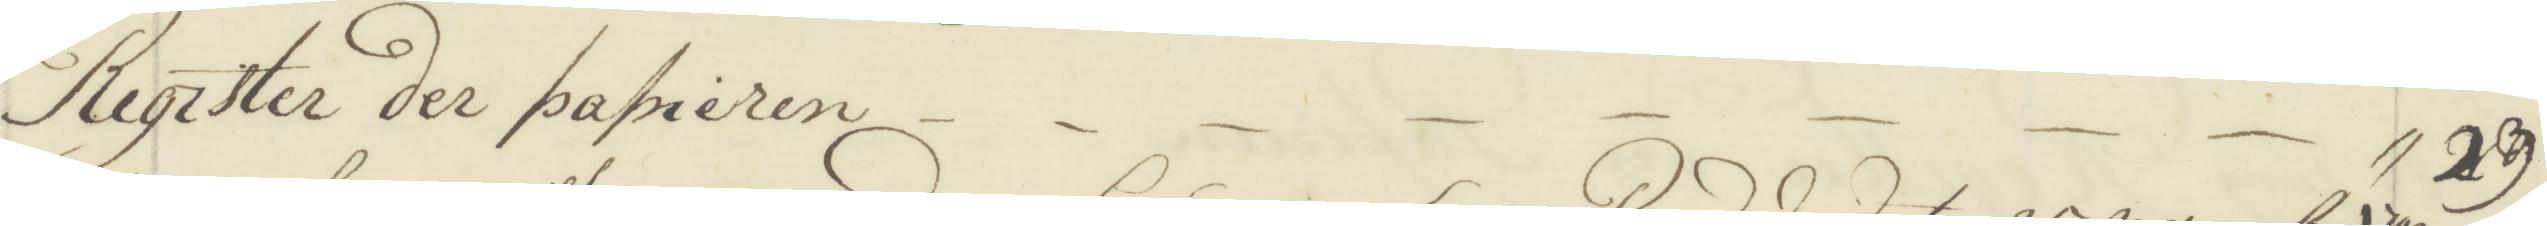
Register der papieren – – — — — — — — „ 23
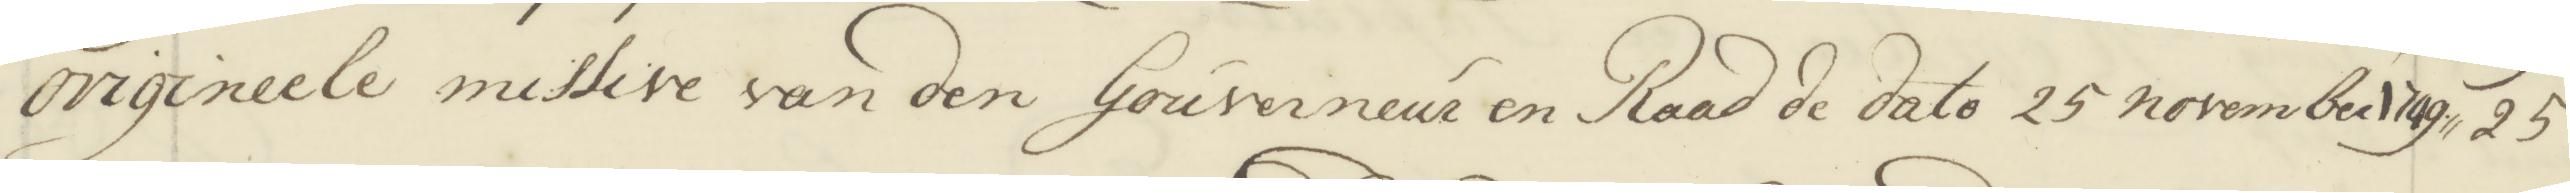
origineele missive van den Gouverneur en Raad de dato 25 november 1749 „ 25
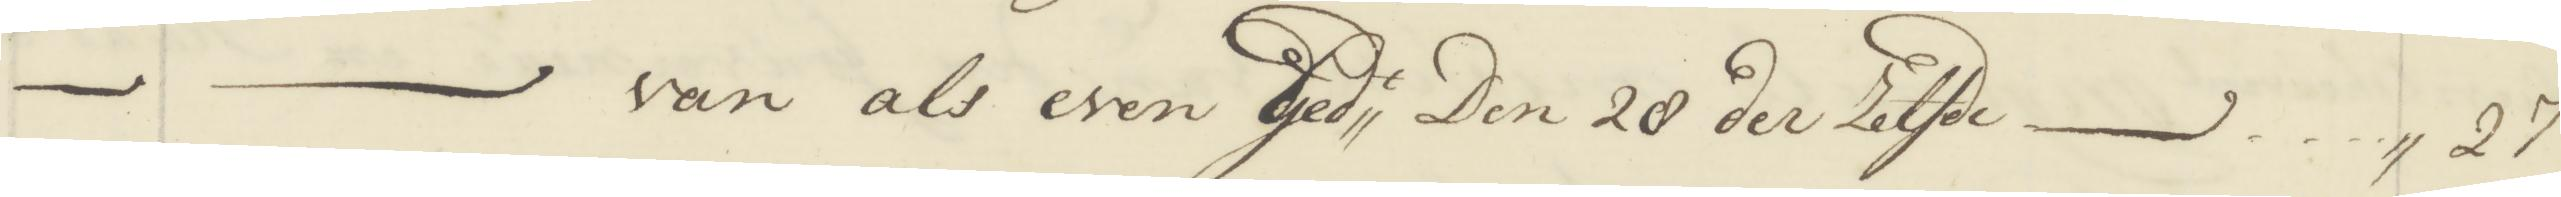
_o _o van als even Ged„t Den 28 der zelfde _o - - - - „ 27
